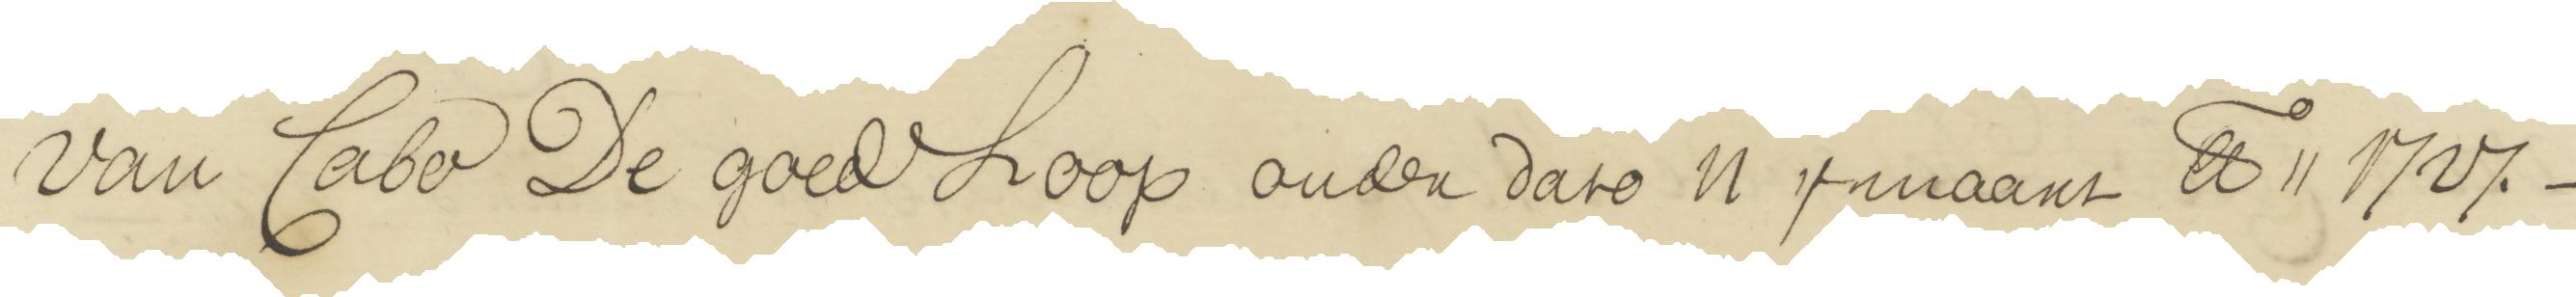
van Cabo De goede hoop onder dato 11„' maart a„o 1727. —
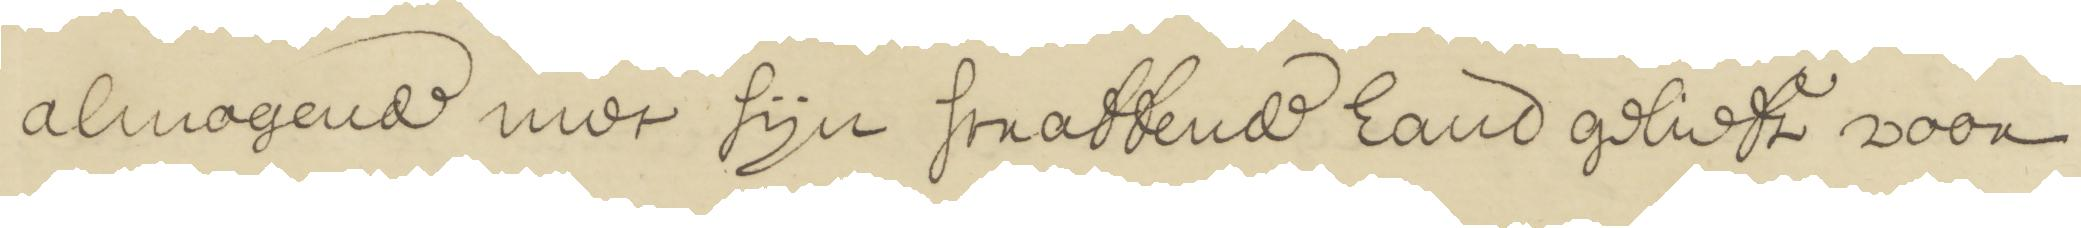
almogende met sijn straffende hand gelieft voor
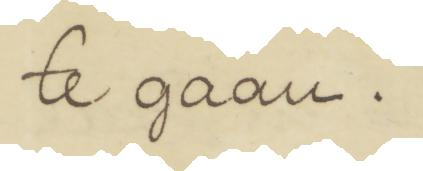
te gaan.
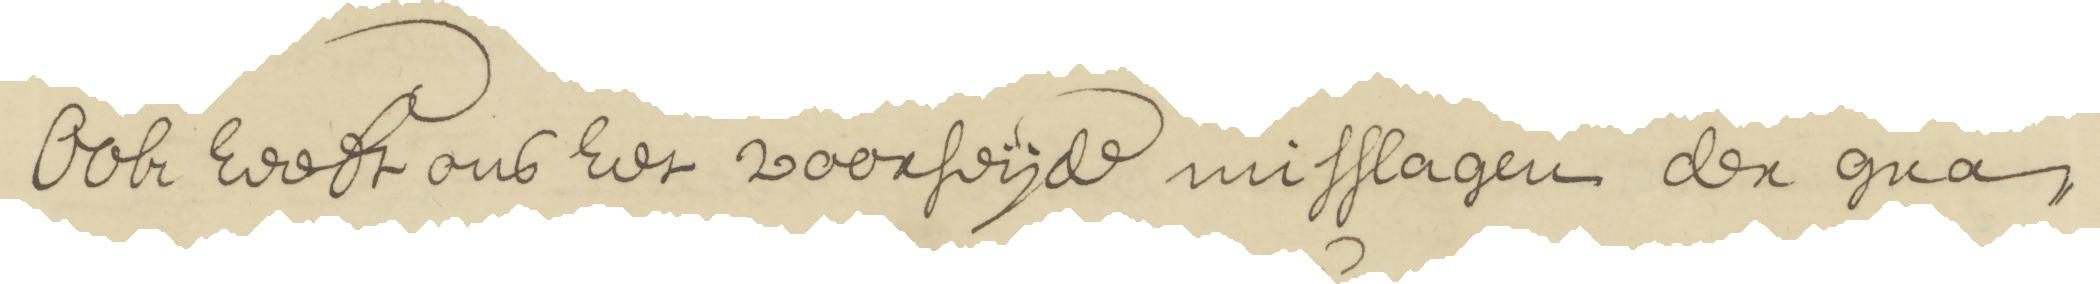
Ook heeft ons het voorseijde misslagen der gra„
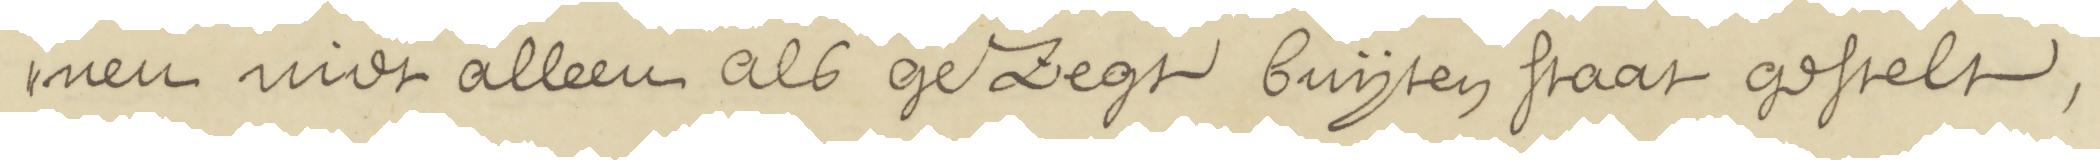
„nen niet alleen als gezegt buijten staat gestelt,
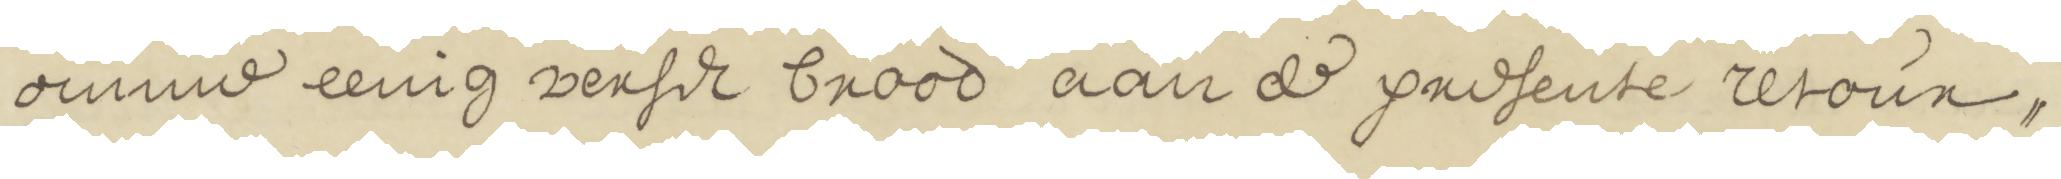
omme eenig versch brood aan de presente retour„
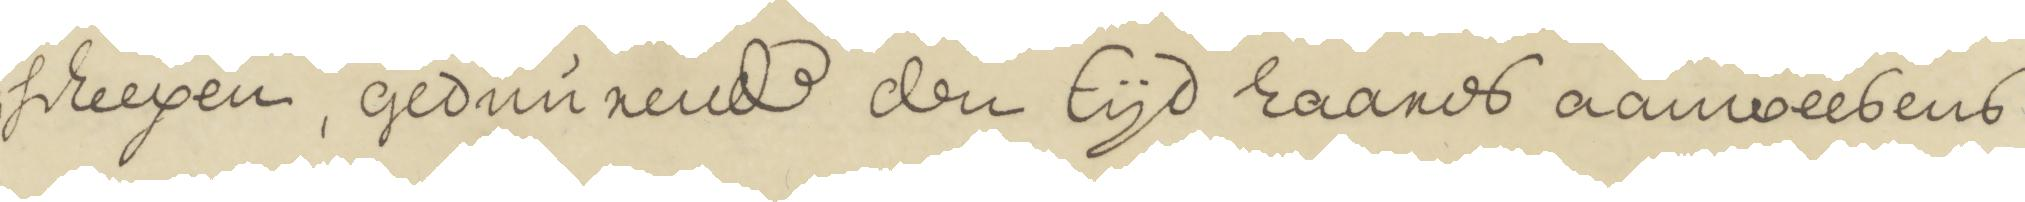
scheepen, geduurende den tijd haares aanweesens
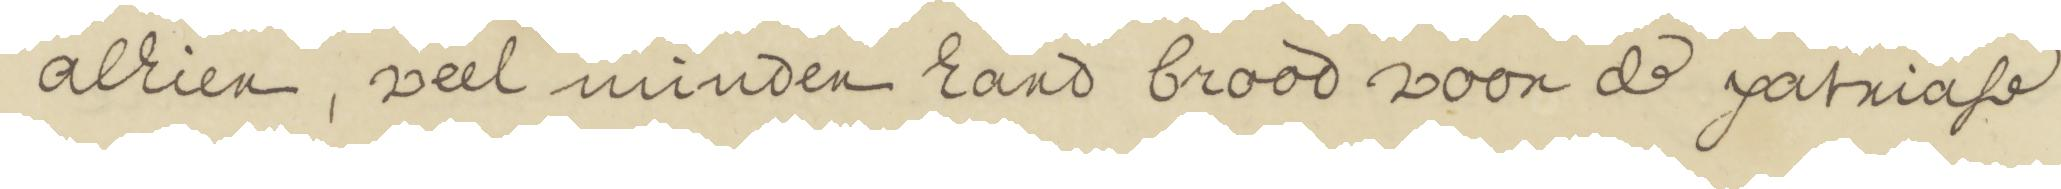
alhier, veel minder hard brood voor de patriase
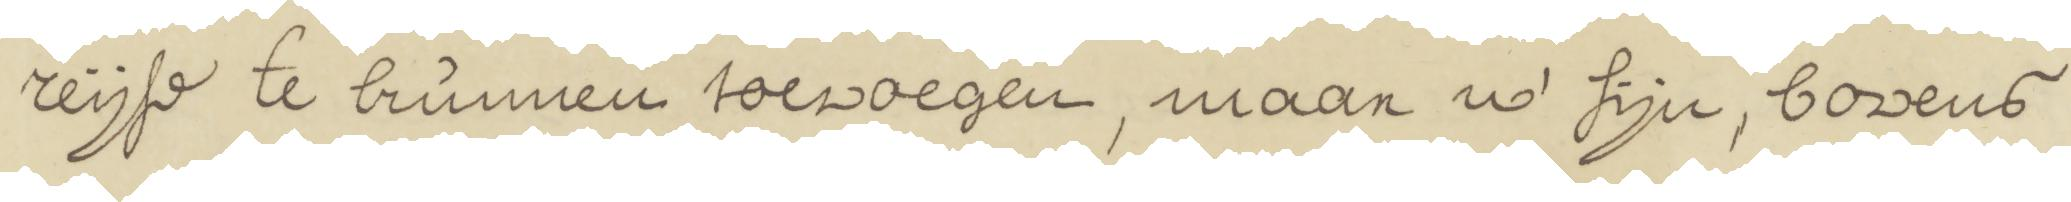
reijse te kunnen toevoegen, maar w' sijn, bovens
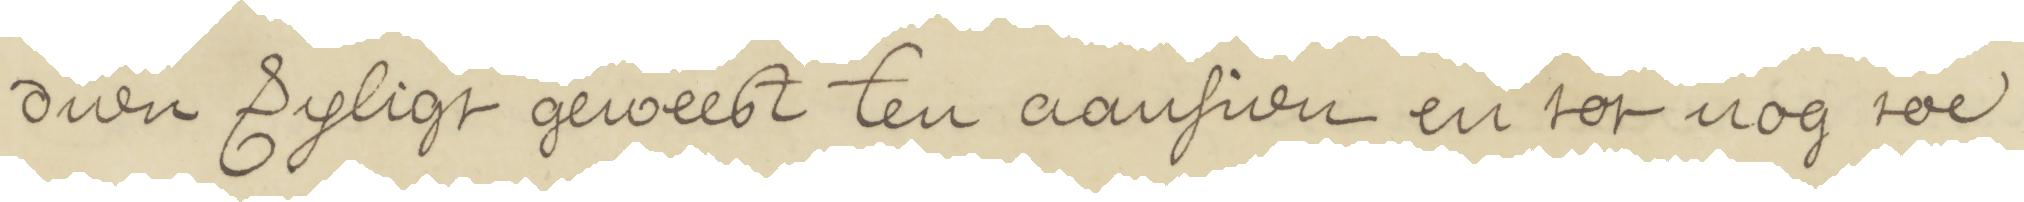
dien verpligt geweest ten aansien en tot nog toe
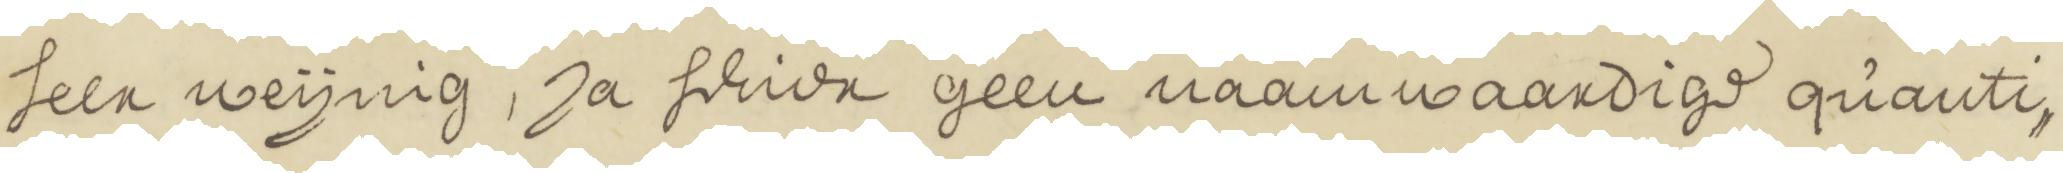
seer weijnig, ja schier geen naamwaardige quanti„
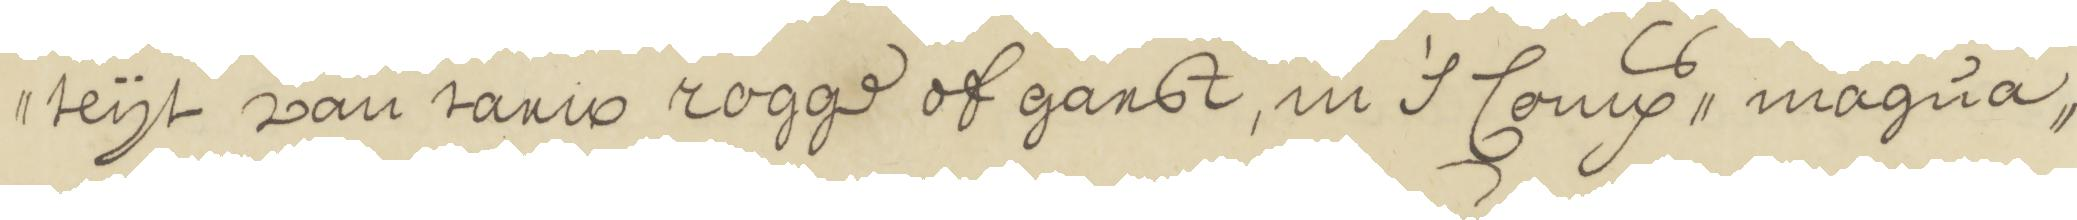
„teijt van tarw rogge of garst, in ’s Comp„s magua
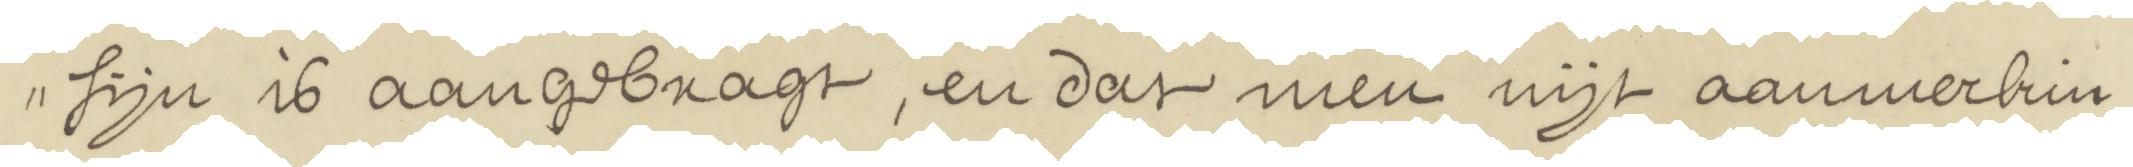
„sijn is aangebragt, en dat men uijt aanmerkin,
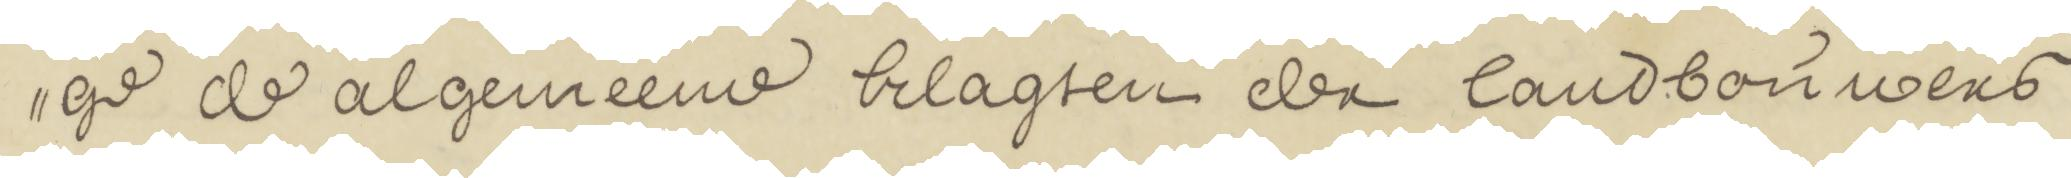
„ge de algemeene klagten der landbouwers
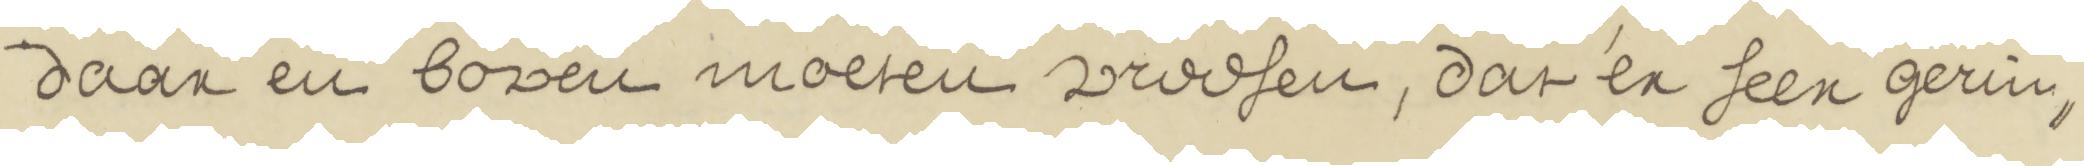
daar en boven moeten vreesen, dat 'er seer gerin„
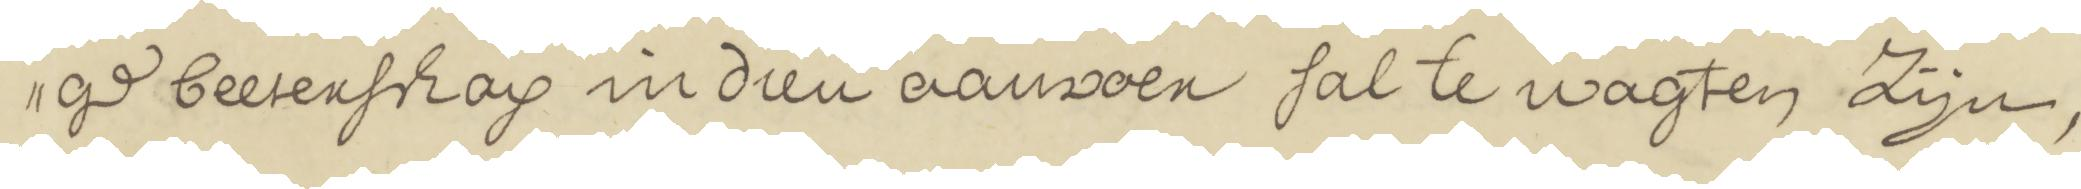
„ge beeterschap in dien aanvoer sal te wagten zijn
